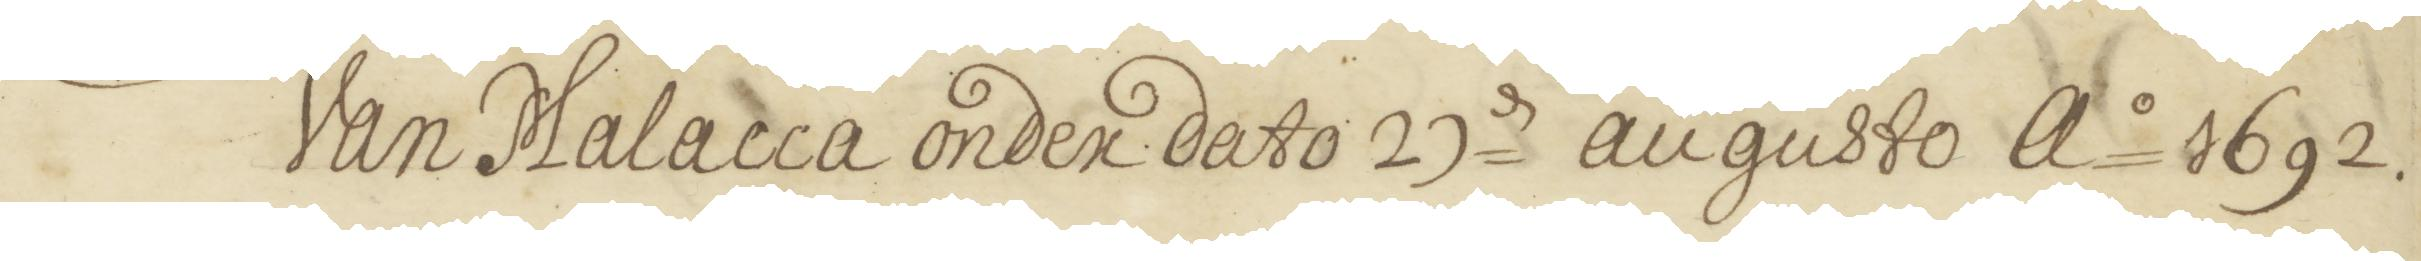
Van Malacca onder dato 23=en augusto A=o 1692.
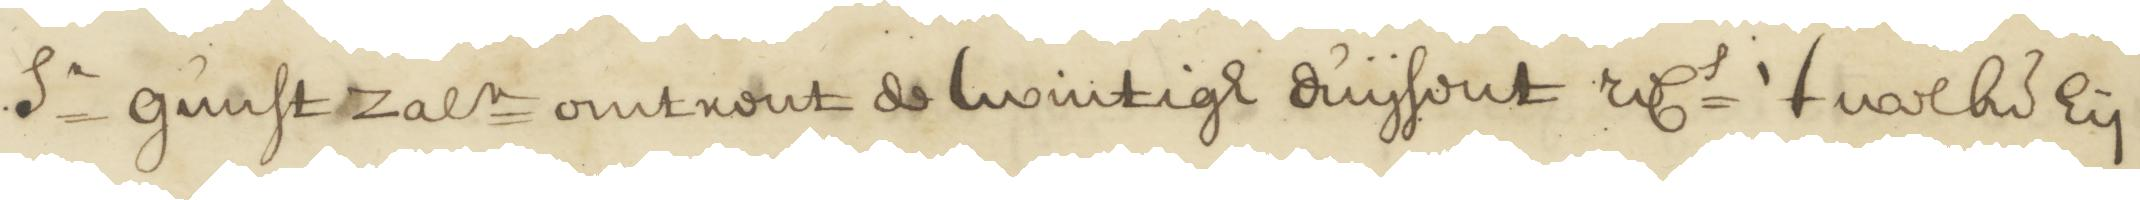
s=r gunst zal=r omtrent de twintigh duijsent rx=s ’t welke hij
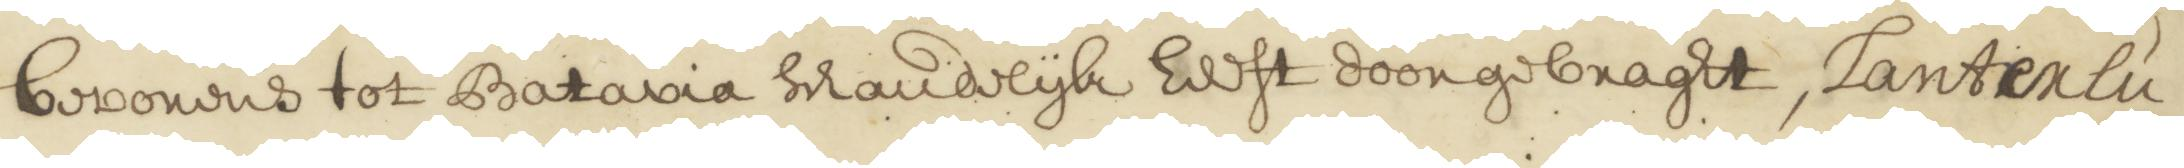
bevorens tot Batavia schandelijk heeft door gebraght, lanterlu
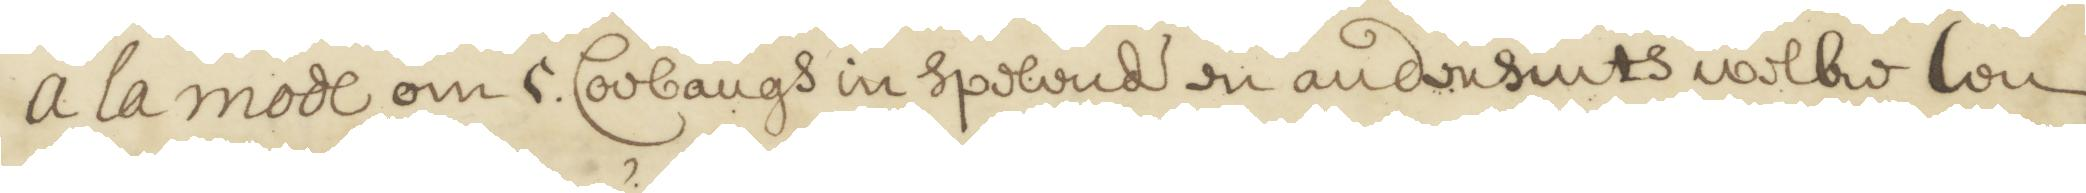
a la mode om 5. Coebangs in spelende en andersints welke ten
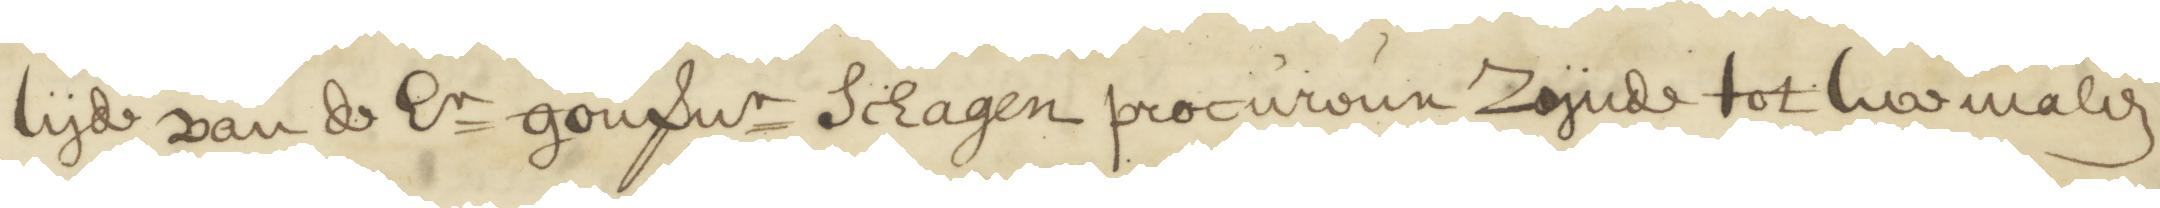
tijde van de h=r gouvern=r schagen procureur zijnde tot twe malen
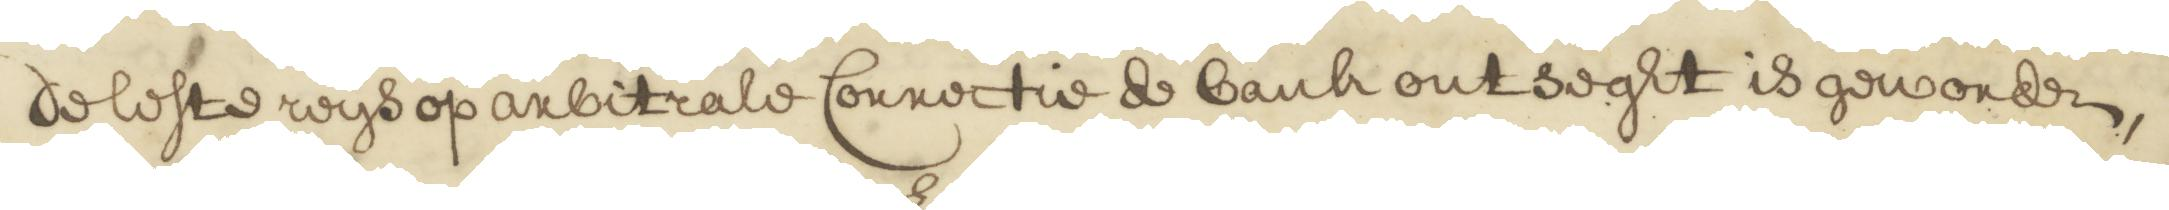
de leste reijs op arbitrale Correctie de bank ontseght is geworden,
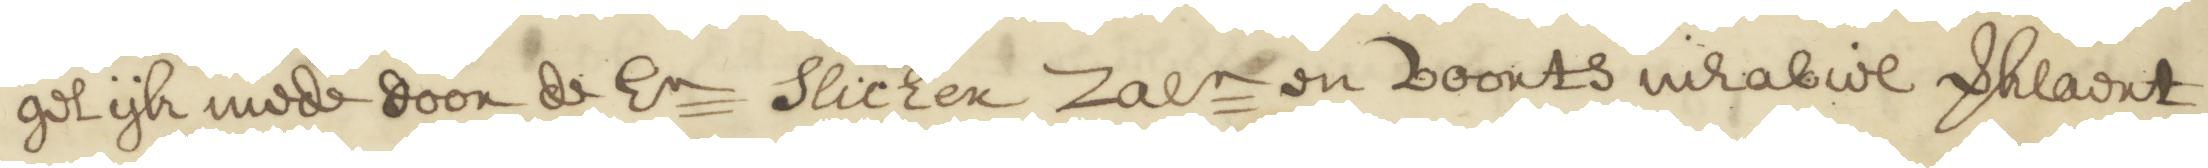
gelijk mede door de h=r slicher zal=r en voorts inhabiel verklaert,
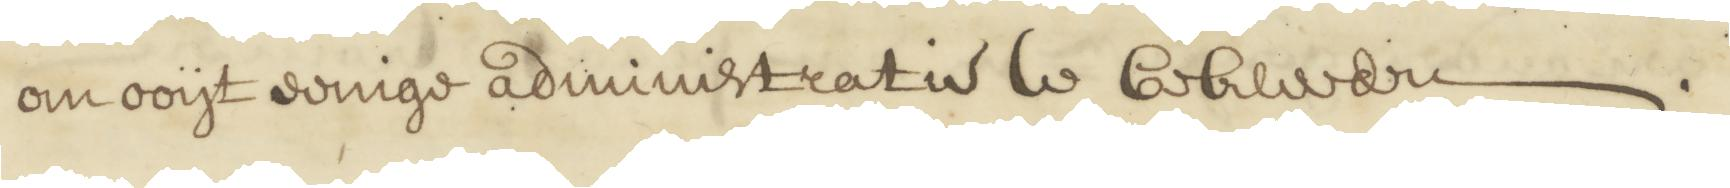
om ooijt eenige administratie te bekleeden.
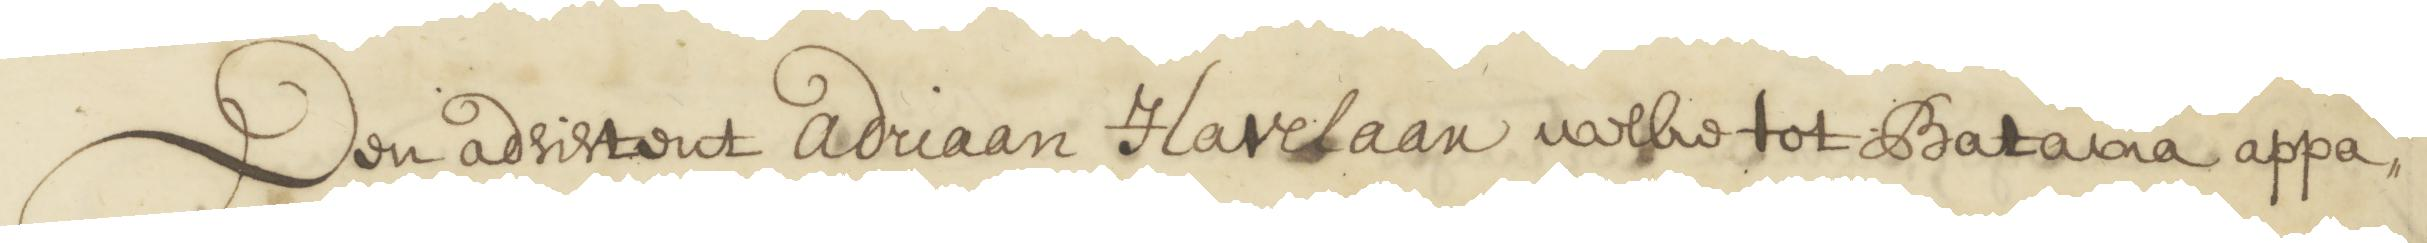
Den adsistent adriaan Havelaar welke tot Batavia appa„
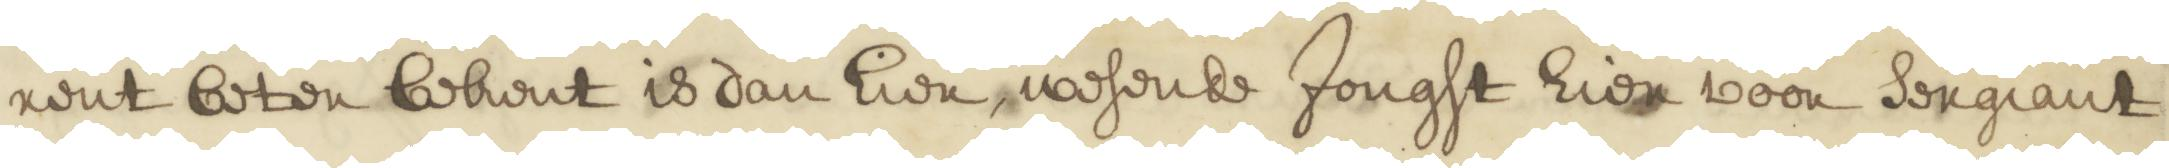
rent beter bekent is dan hier, wesende Jongst hier voor sergiant
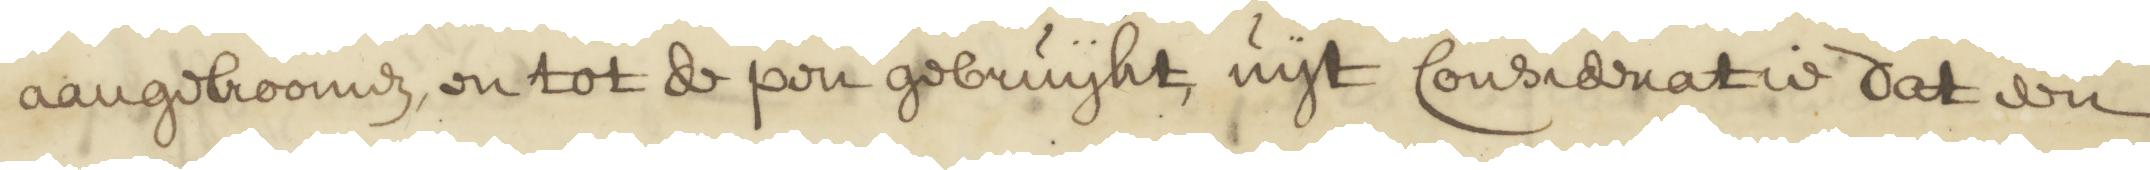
aangekoomen, en tot de pen gebruijkt, uijt Consideratie dat een
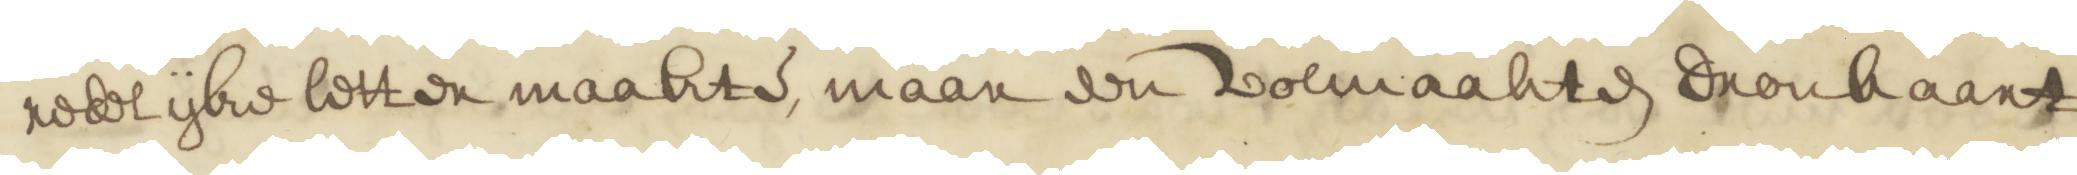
redelijke letter maakte, maar een volmaakten dronkaart
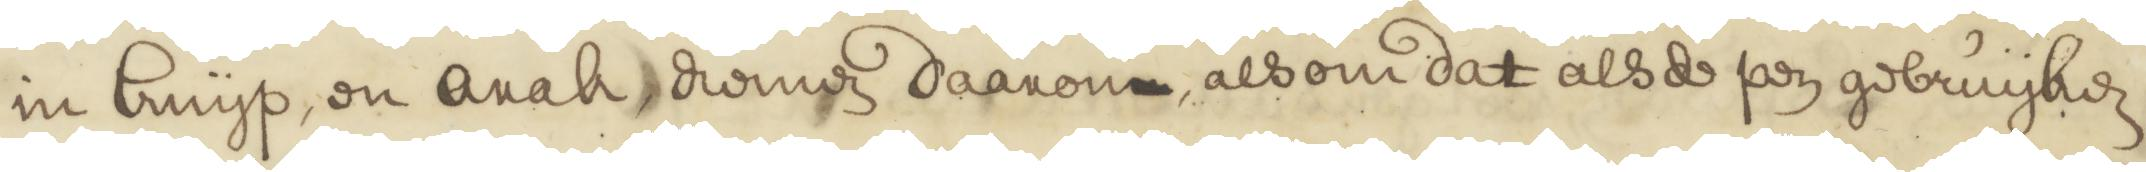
in kuijp, en arak diemen daarom, als om dat als de pen gebruijken
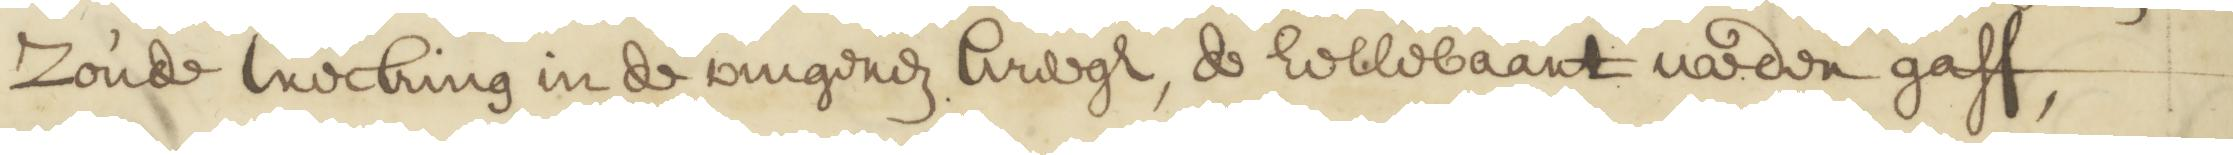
zoude trecking in de vingeren kreegh, de hellebaart weder gaff,
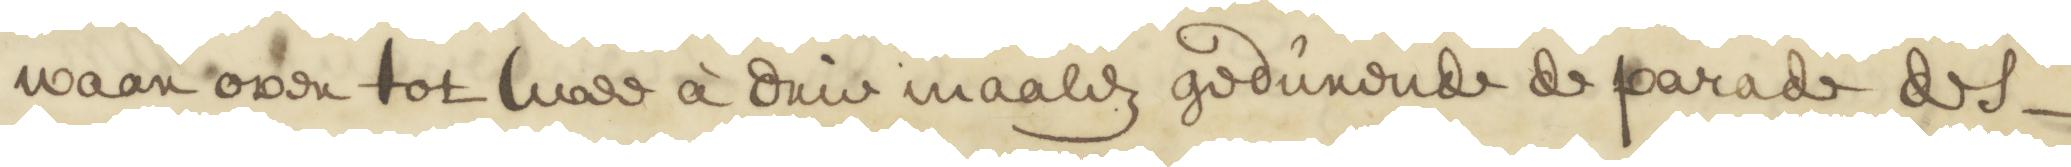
waar over tot twee à drie maalen gedurende de parade des
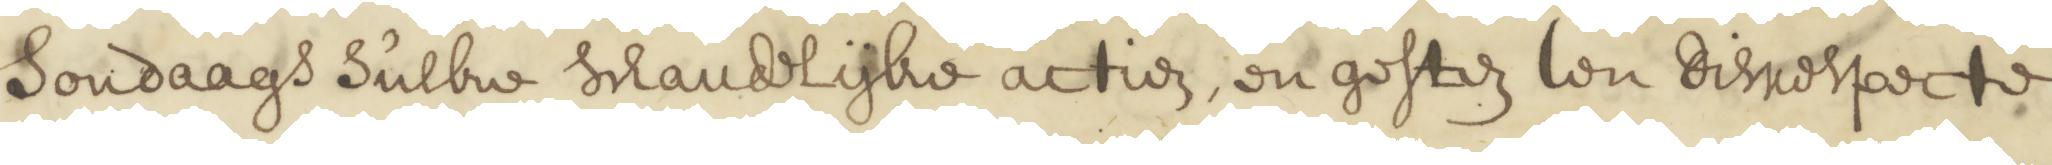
sondaags sulke schandelijke actien, en gesten ten disrespecte
